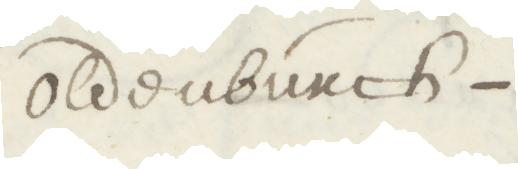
oldenburch -
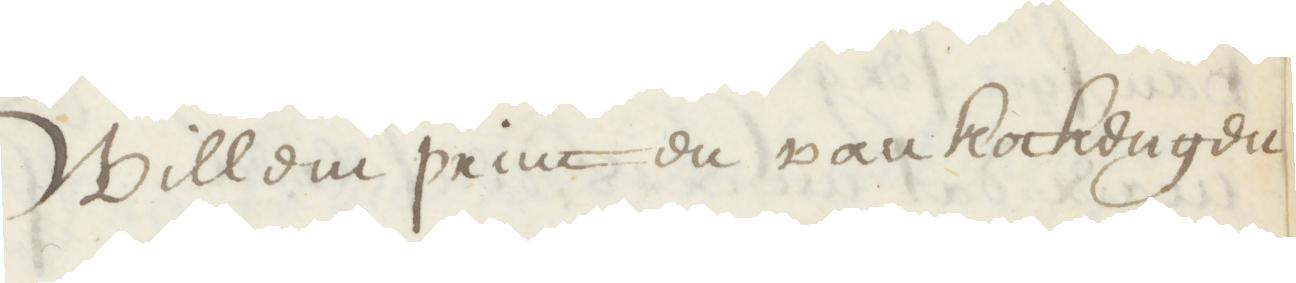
Willem princen van kockengen
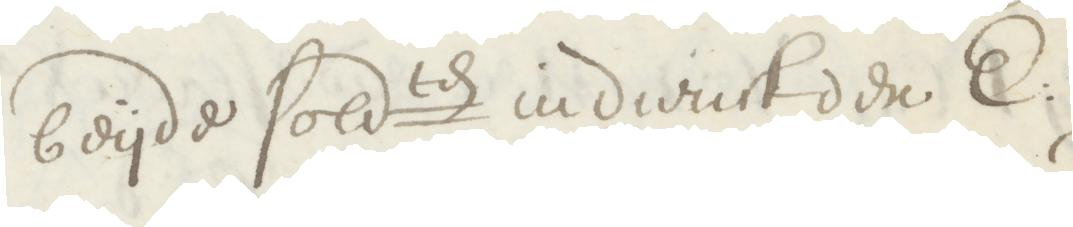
beijde sold=ten in dienst der E:
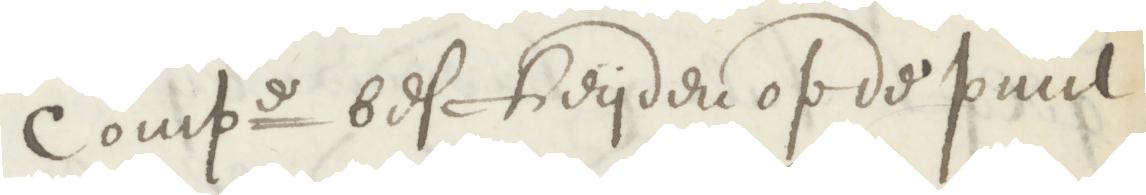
Comp=e bescheijden op de punt
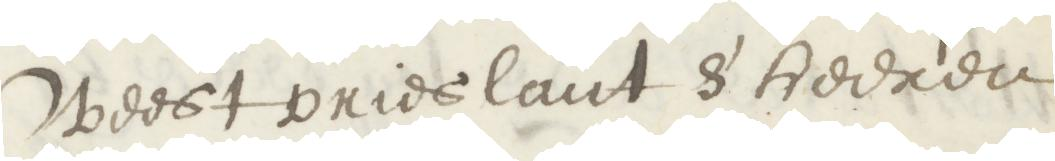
weest vrieslant s' heeren
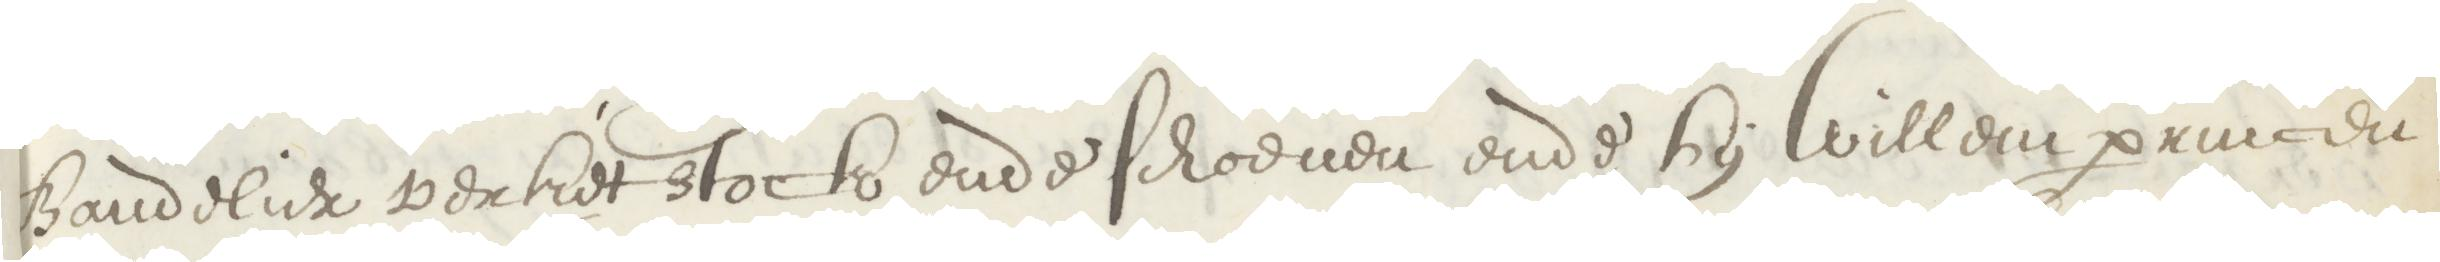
Bandelier verket stock ende schoenen ende hij willem princen
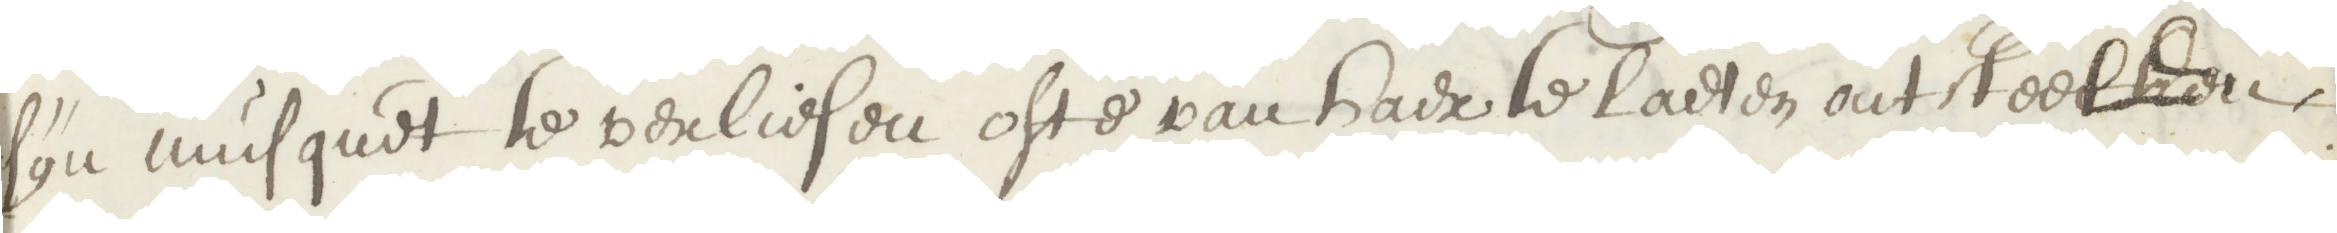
sijn musquet te verliesen ofte van haer te laeten ontsteelen,
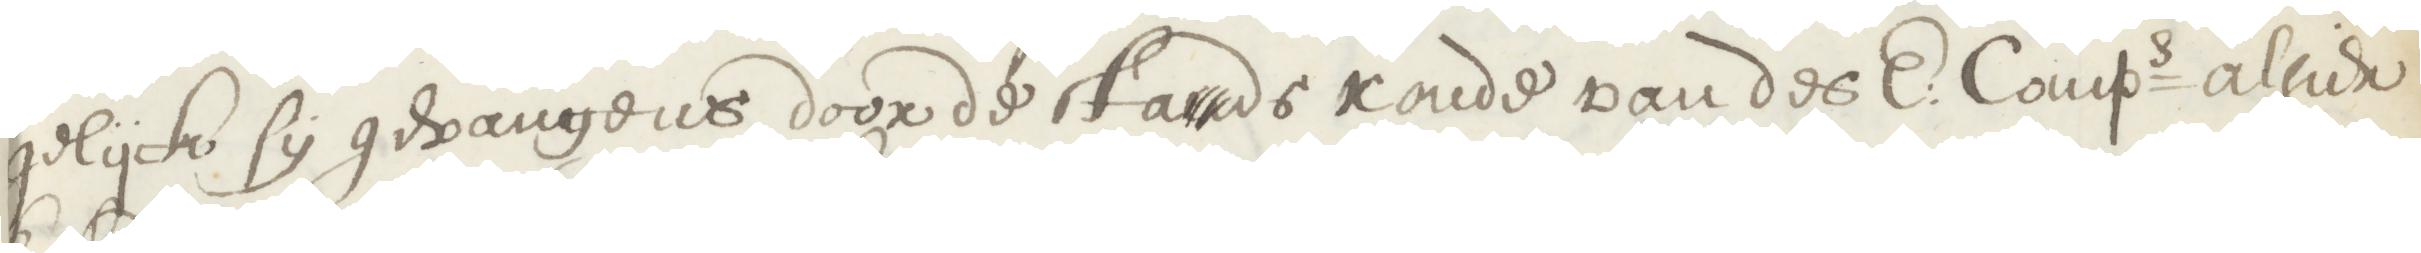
gelijck sij gevangens door de stands ronde van des E: Comp=s alhier
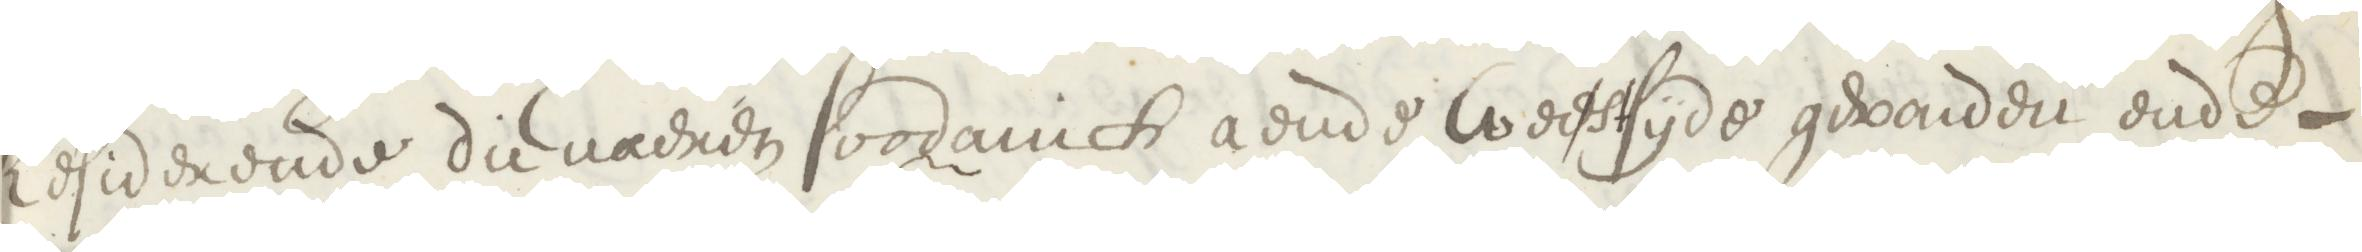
residerende dienaeren soodanich aende weestsijde gevonden ende —
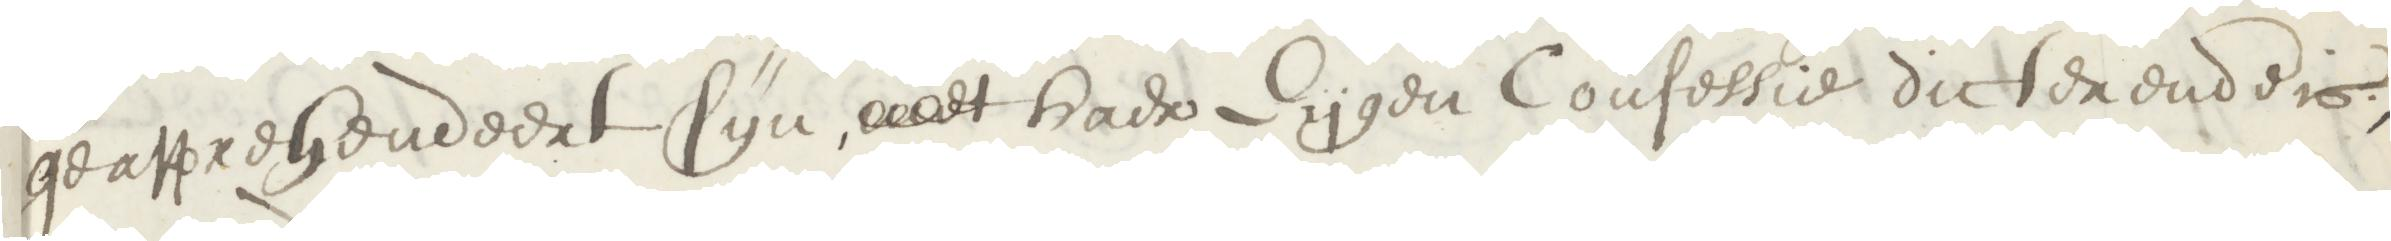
geapprehendeert sijn, met haer Eijgen Confessie dicterende is,
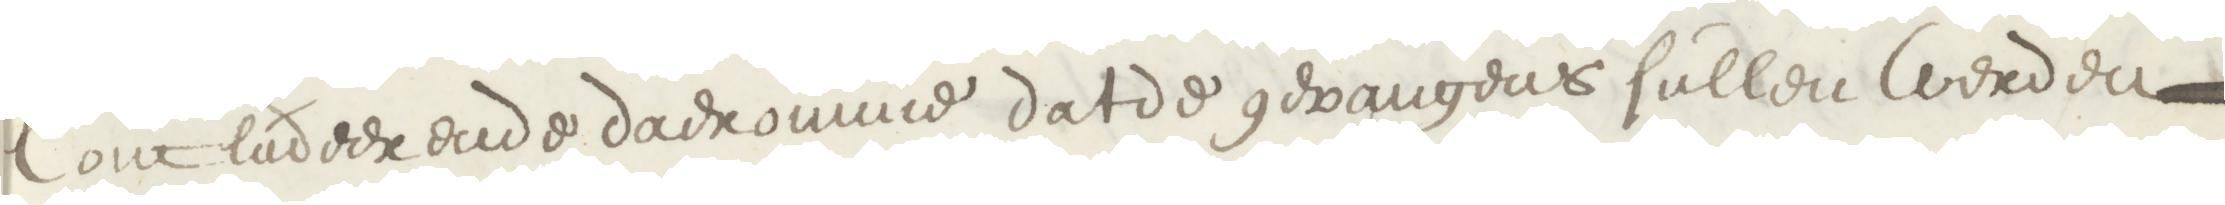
Concludeerende daeromme dat de gevangens sullen werden
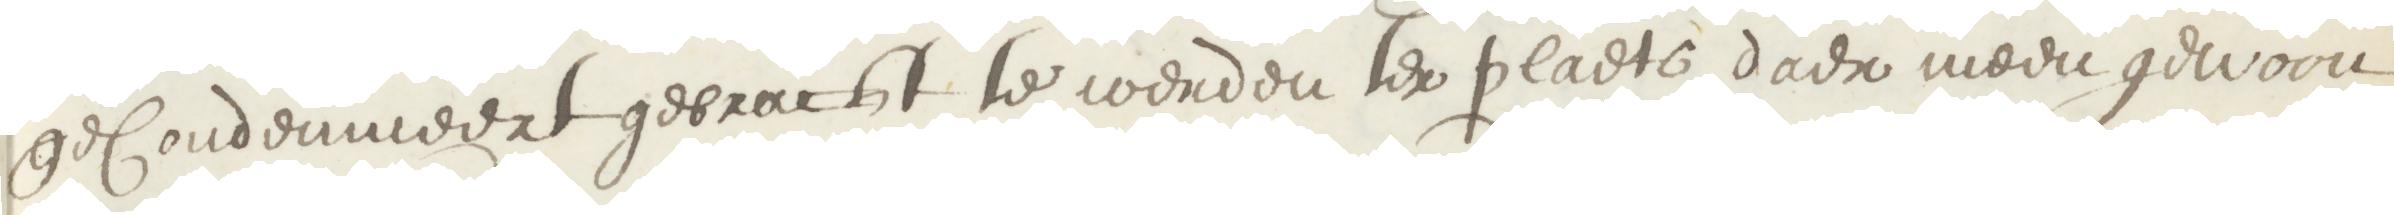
gecondemneert gebracht te werden ter plaets daer meen gewoon
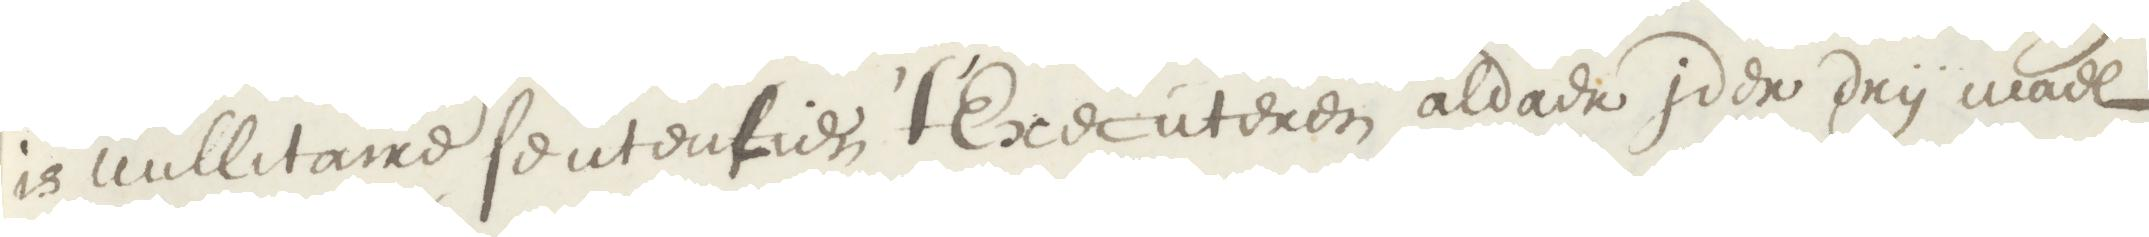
is millitaire sentensien ’t Executeren aldaer jder drij mael
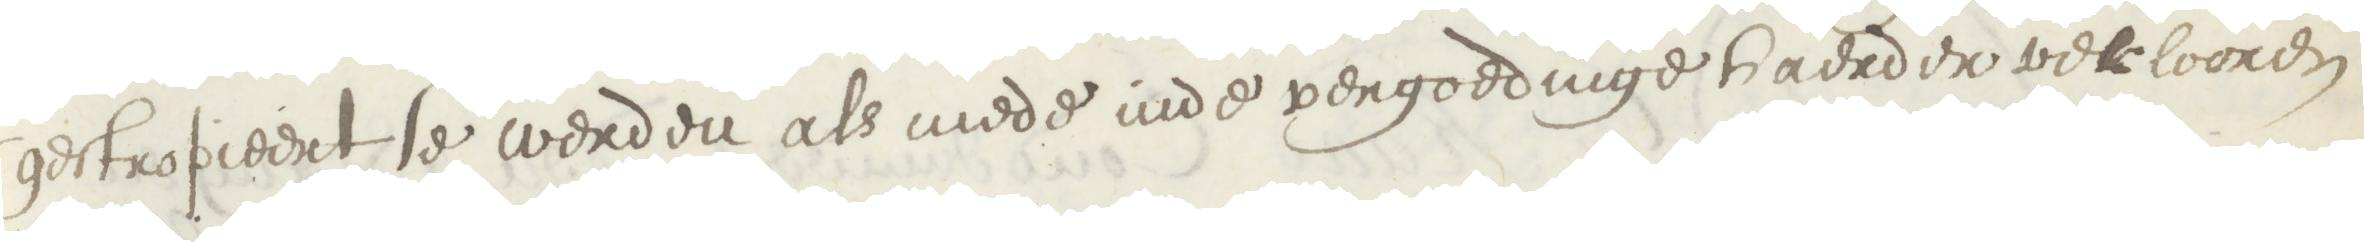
gestropieert te werden als mede inde vergoedinge haerder verlooren
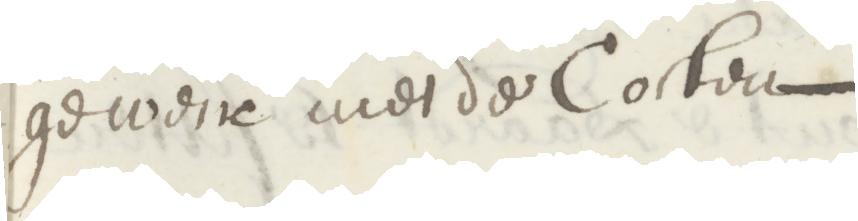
gewere met de Costen
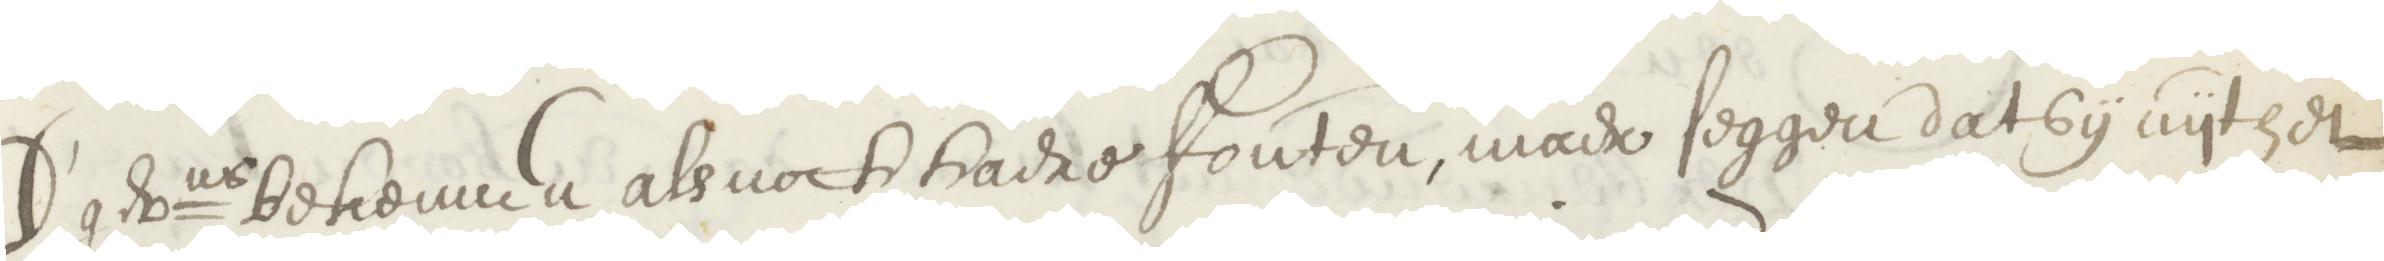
D’ gev=ns bekennen als noch haere fouten, maer seggen dat bij uijt het
